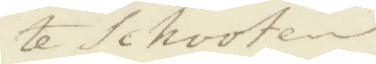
te Schooten
